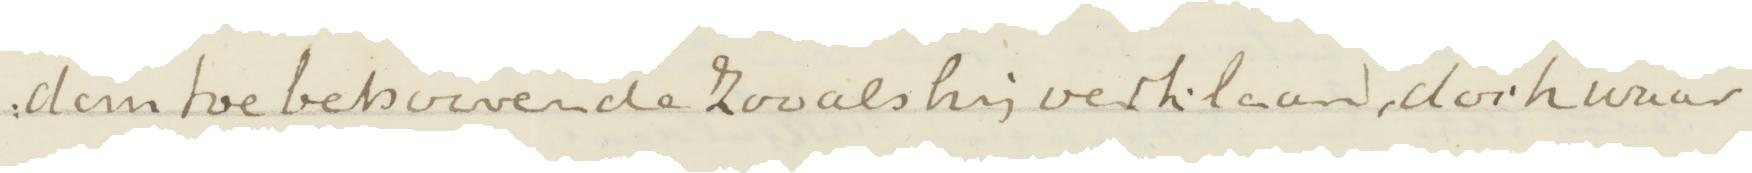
:dom toe behoorende zoo als hij verklaard, doch waar
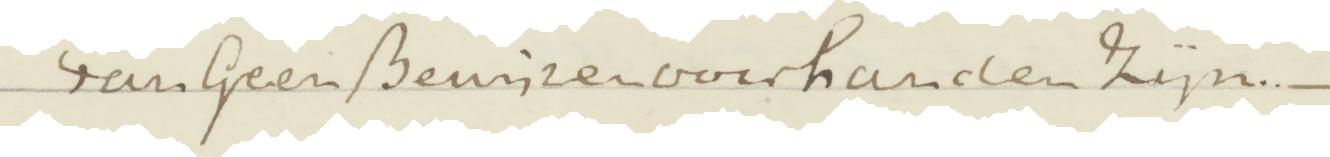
van geen Bewijzen voorhanden Zijn.
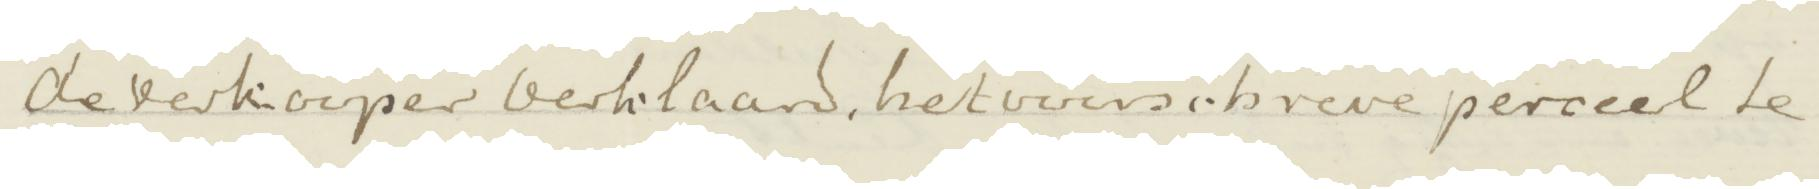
de verkooper verklaard, het voorschreve perceel te
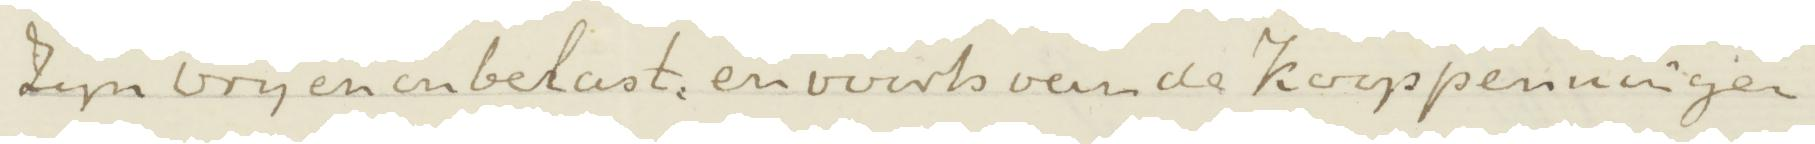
zijn vrij en onbelast, en voorts van de Kooppenningen
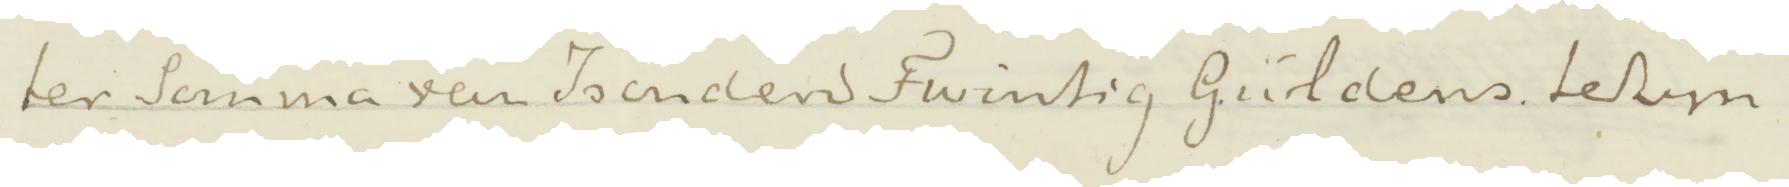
ter somma van Honderd Twintig Guldens te zyn
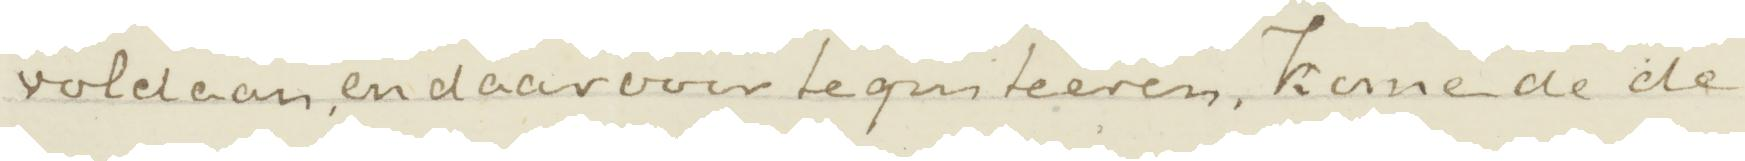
voldaan, en daarvoor te quiteeren, komende de
